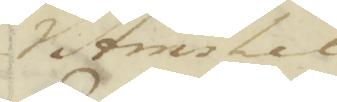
V Amstel
